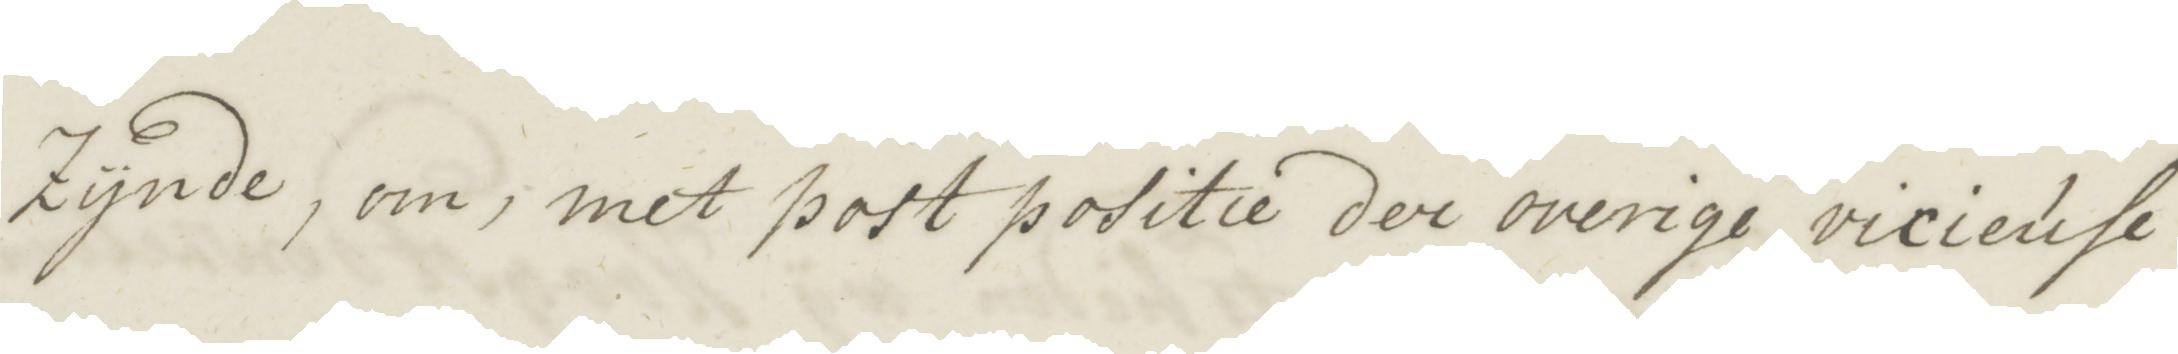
zijnde, om, met post positie der overige vicieuse
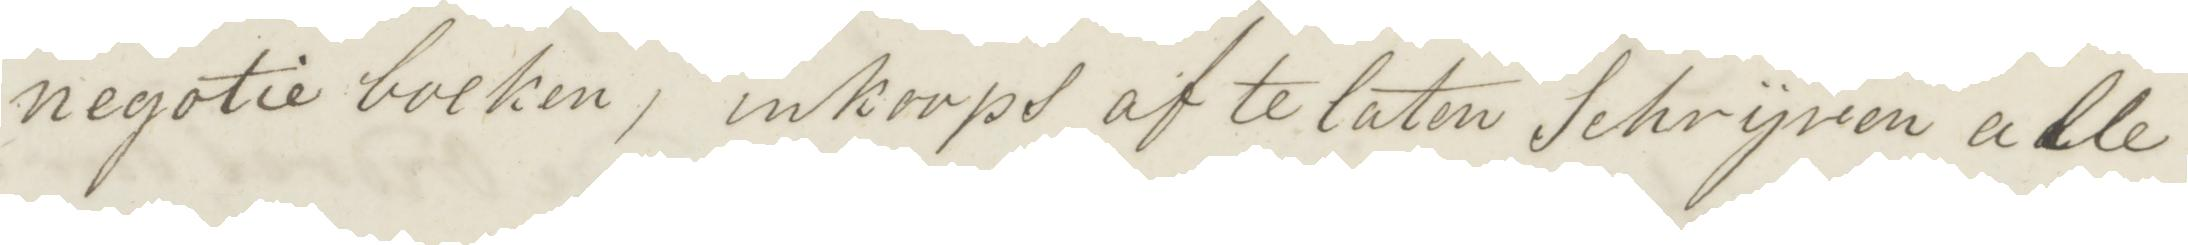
negotie boeken, inkoops af te laten schrijven alle
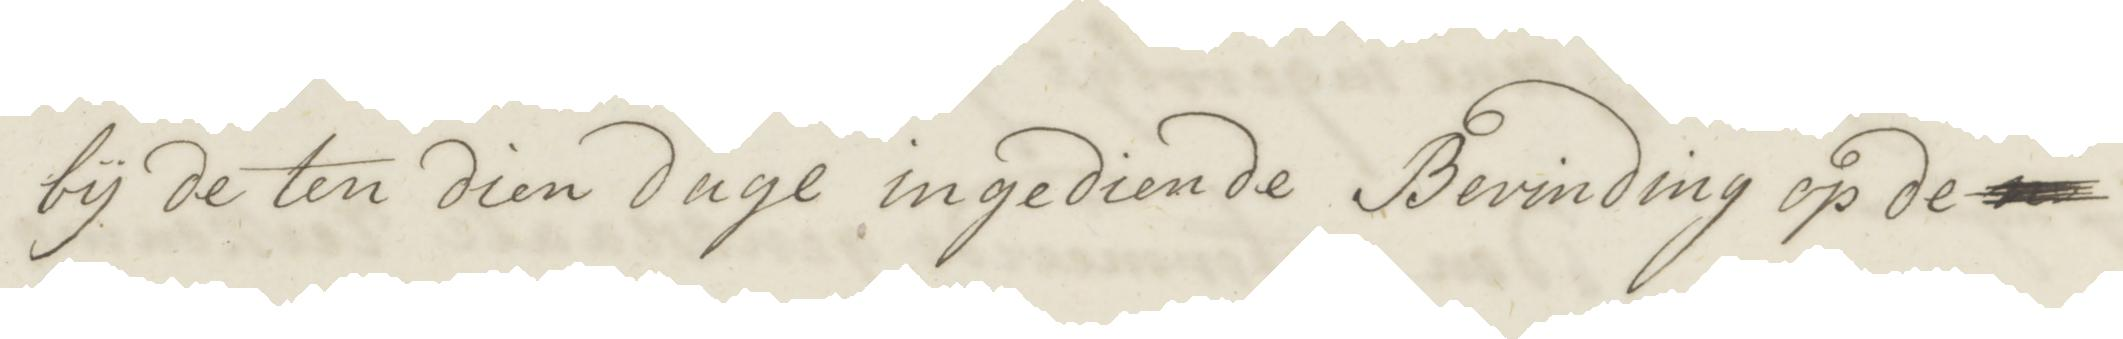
bij de ten dien dage ingediende Bevinding op de ses
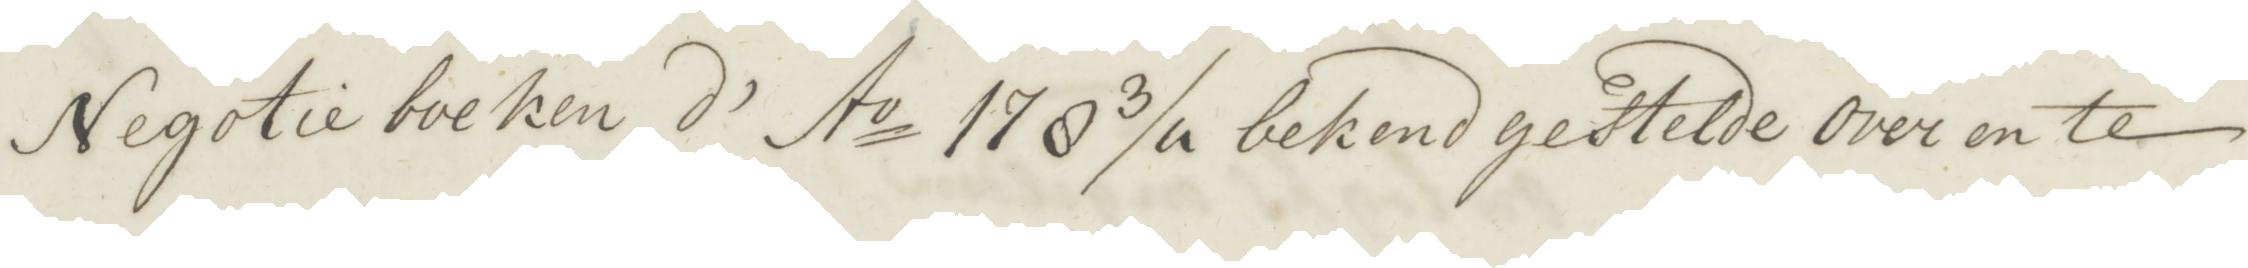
Negotie boeken d’ A=o 178¾ bekend gestelde over en te
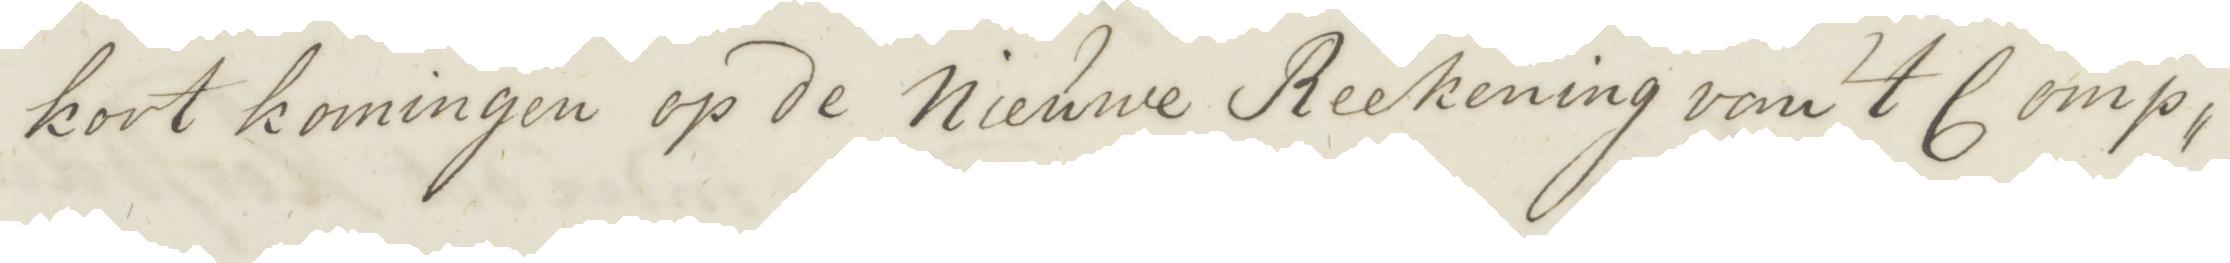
kort komingen op de nieuwe Reekening van ’t Comp„
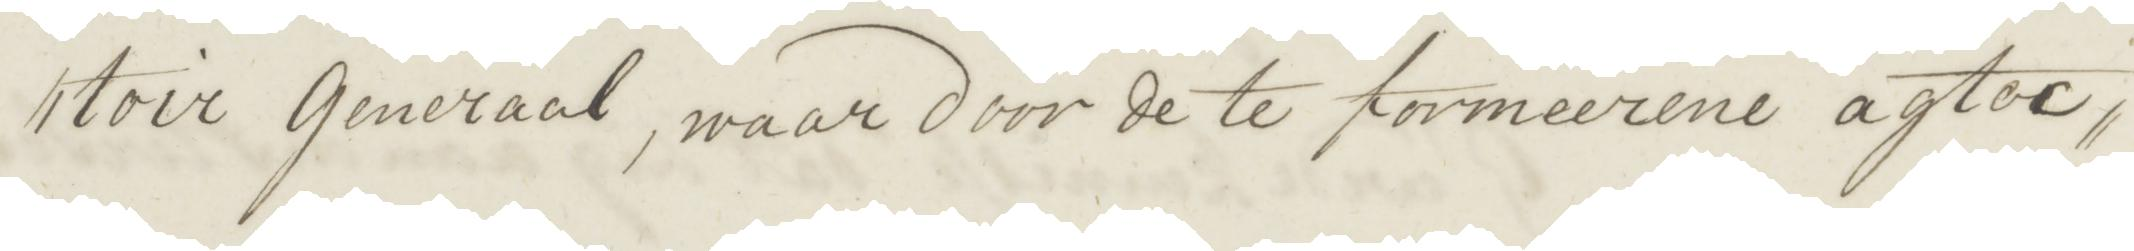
„toir generaal, waar door de te formeerene agter„
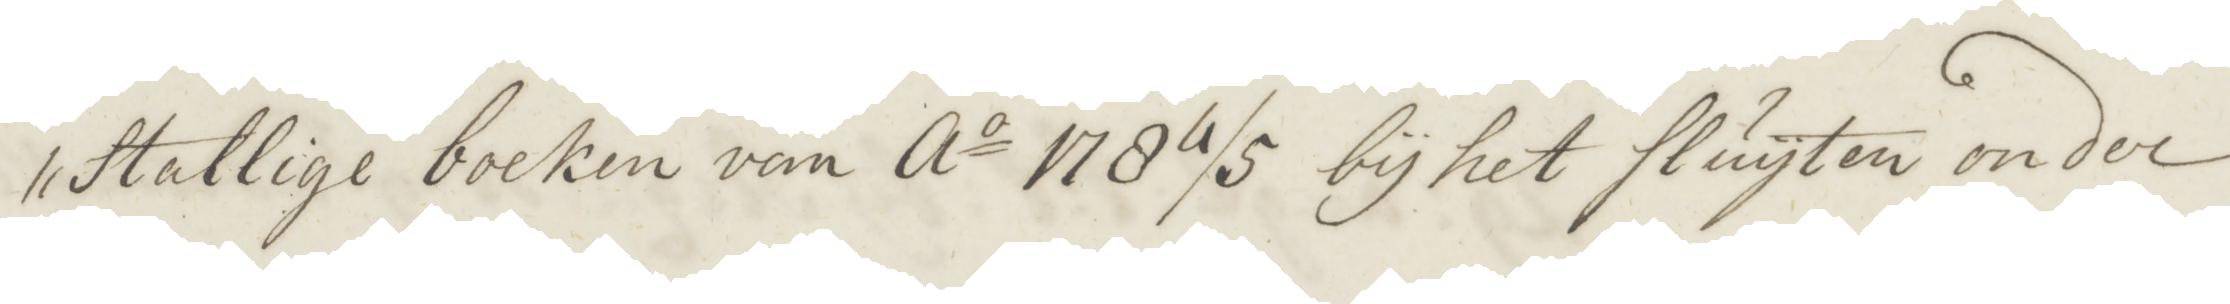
„stallige boeken van A=o 1784/5 bij het sluijten onder
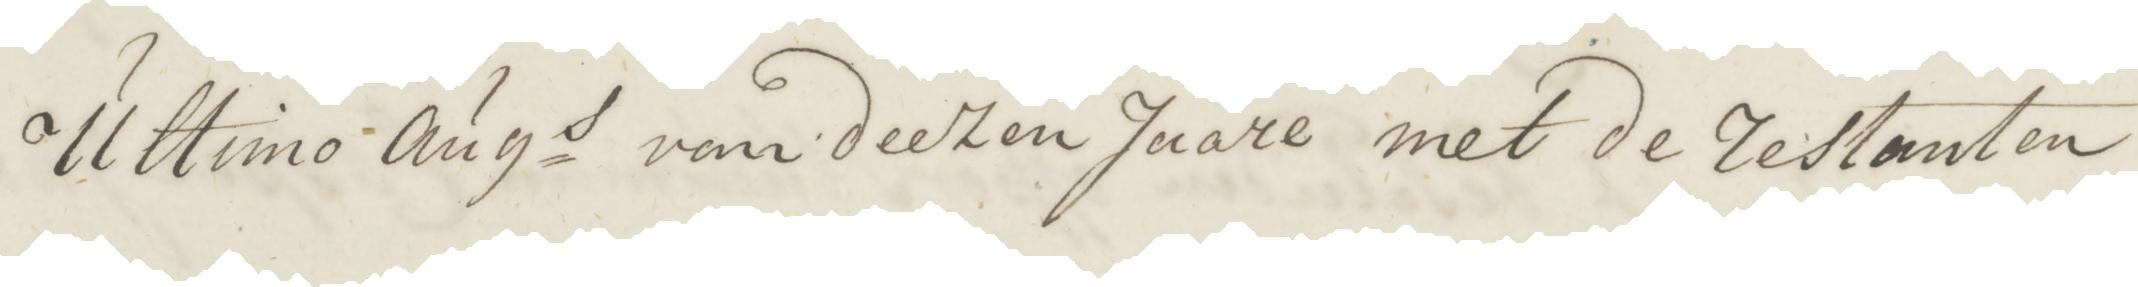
Ultimo Aug=s van deezen Jaare met de restanten
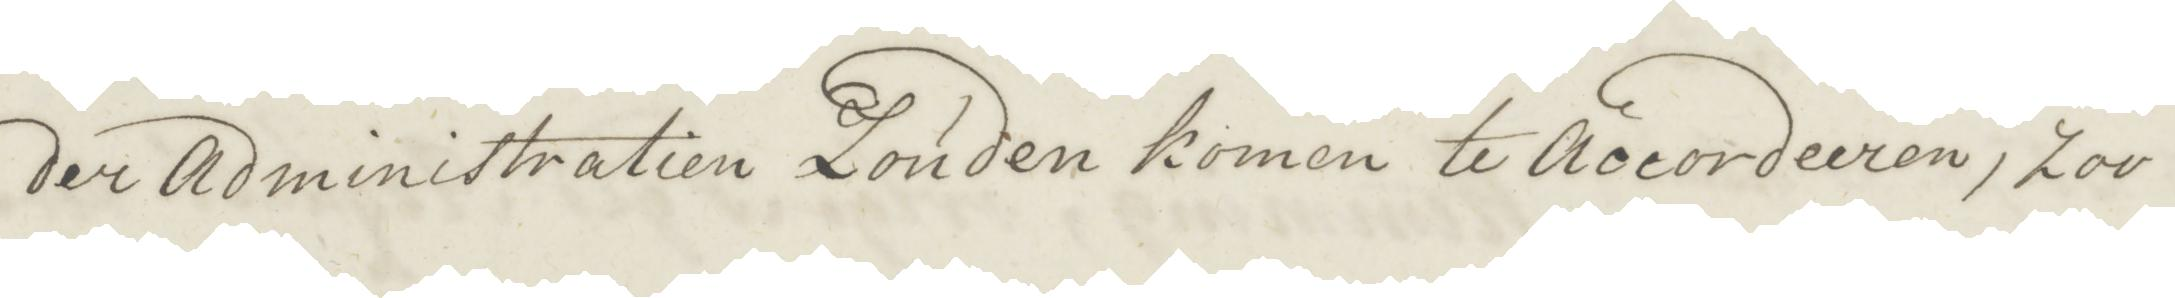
der Administratien zouden komen te accordeeren, zoo
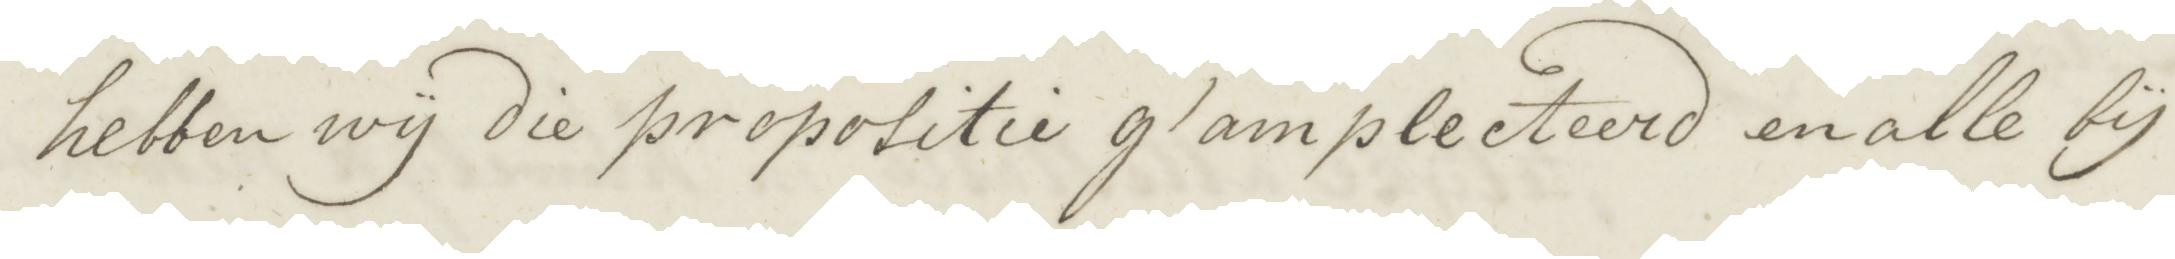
hebben wij die propositie g’amplecteerd en alle bij
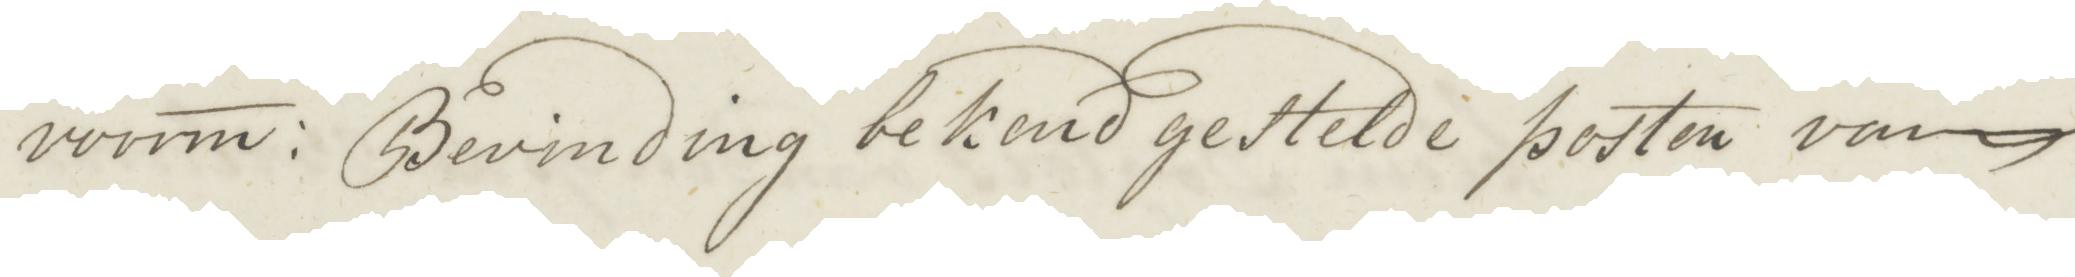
voorm: Bevinding bekend gestelde posten van
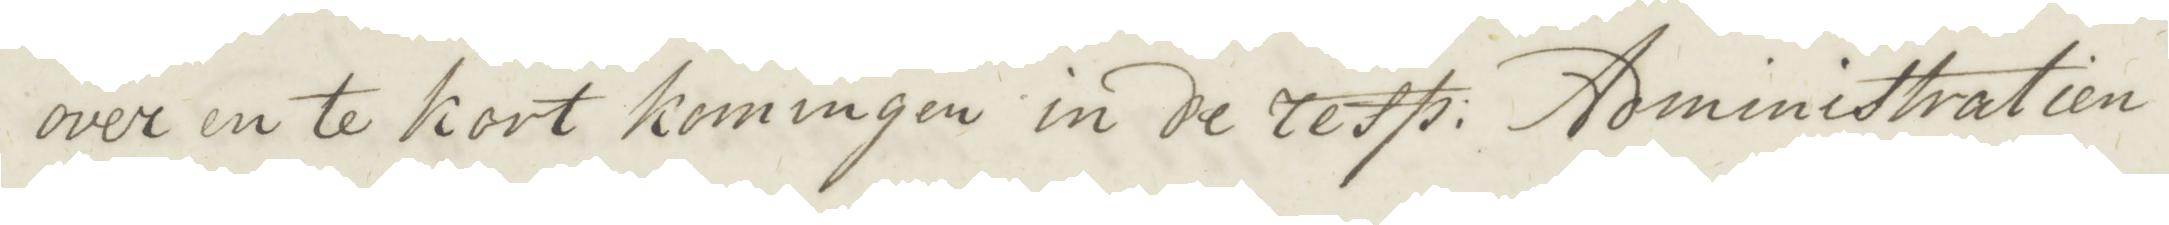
over en te kort komingen in de resp: Administratien
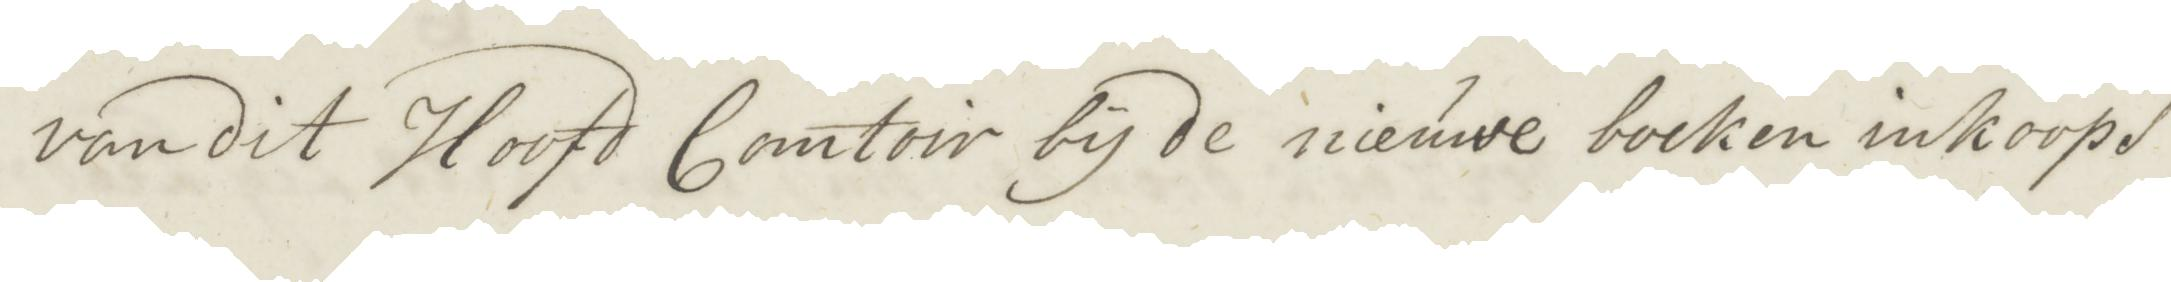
van dit Hoofd Comtoir bij de nieuwe boeken inkoops
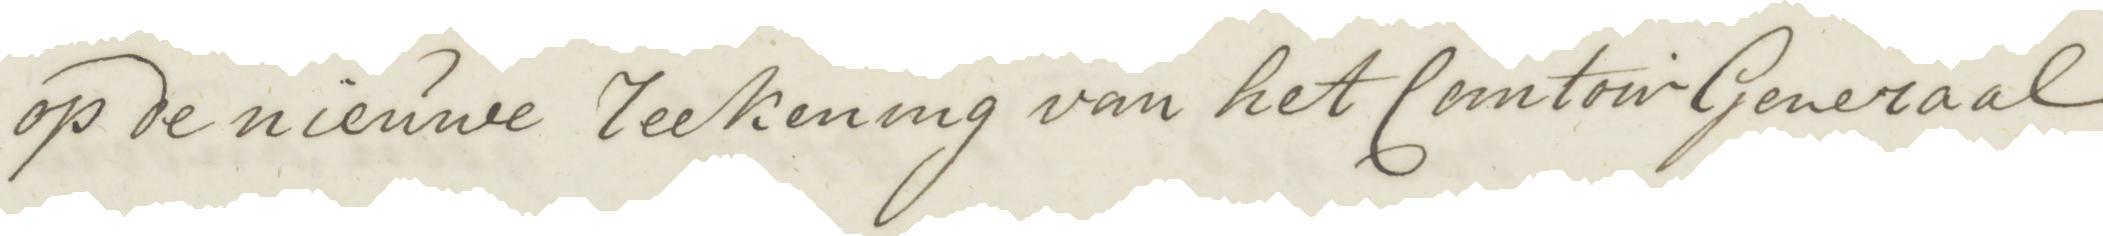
op de nieuwe reekening van het Comtoir Generaal
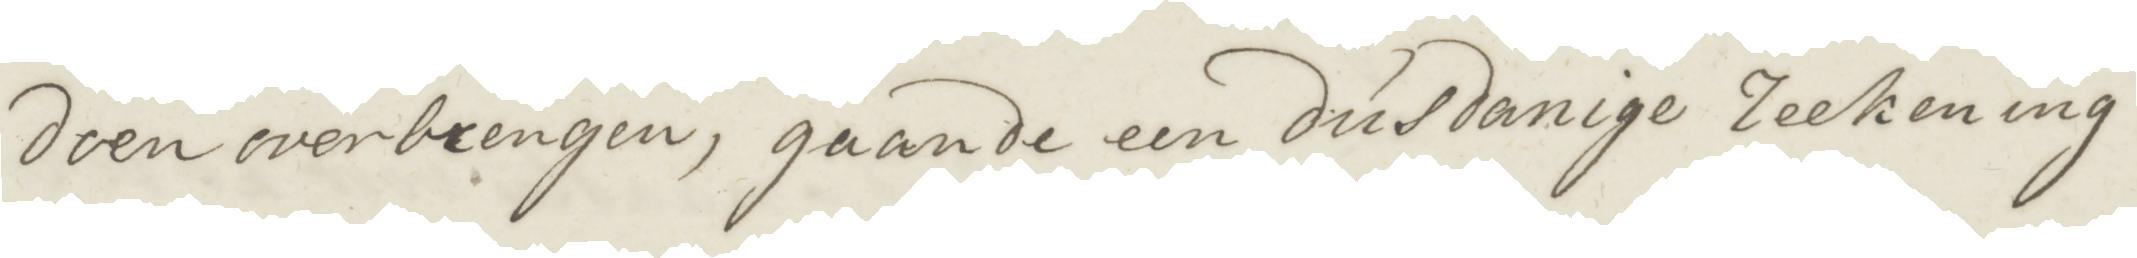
doen overbrengen, gaande een dusdanige reekening
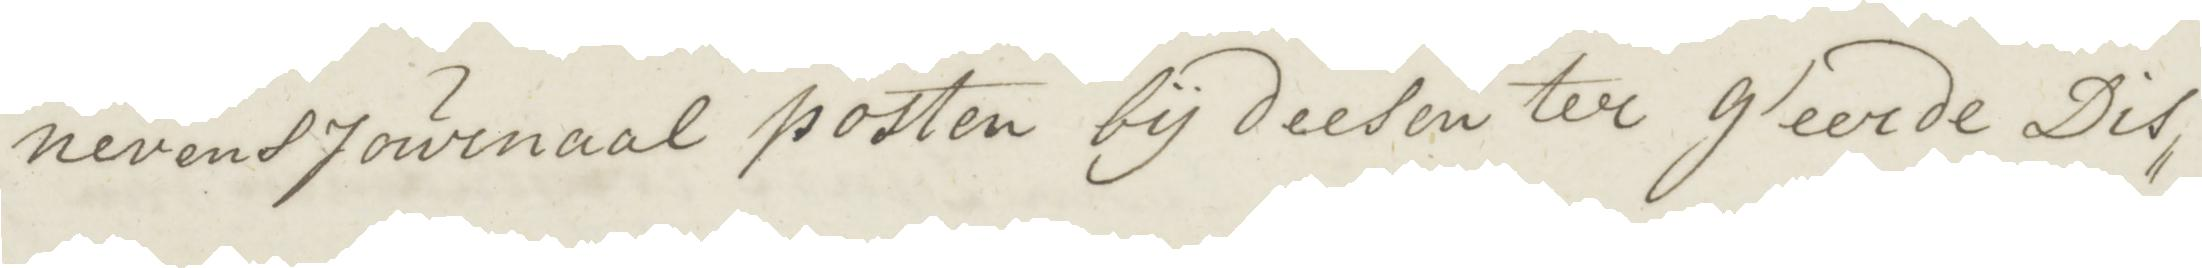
nevens Journaal posten bij deesen ter g’eerde Dis„
